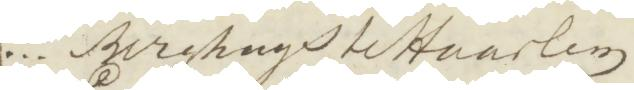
. . . Berghuys te Haarlem
